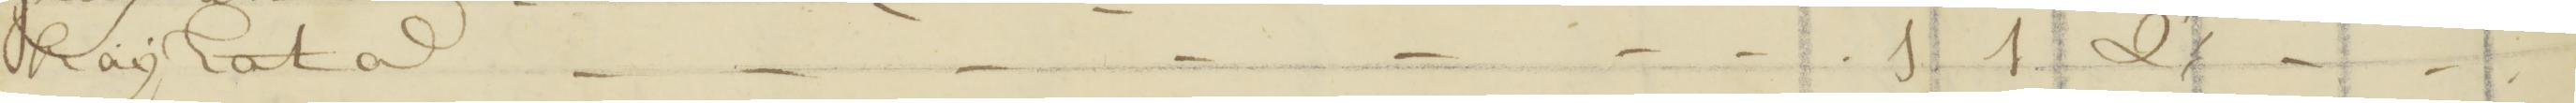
kaij hatoe – – – – – – – . 1 1 2„ — – -
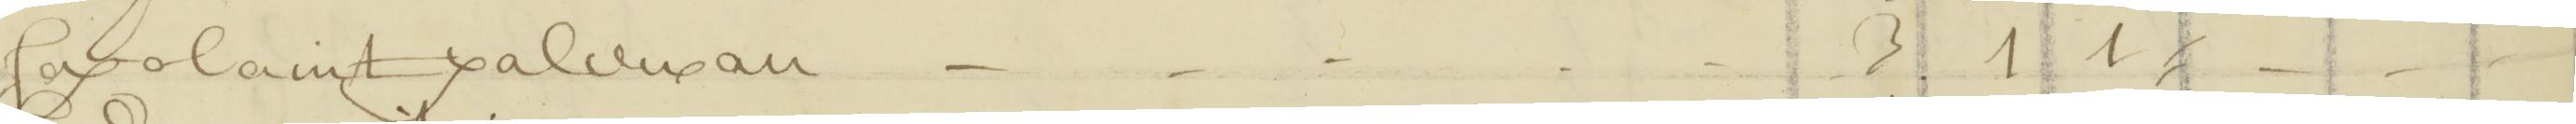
sapolaint palewan – – – - - 3 1 1 „ – – –
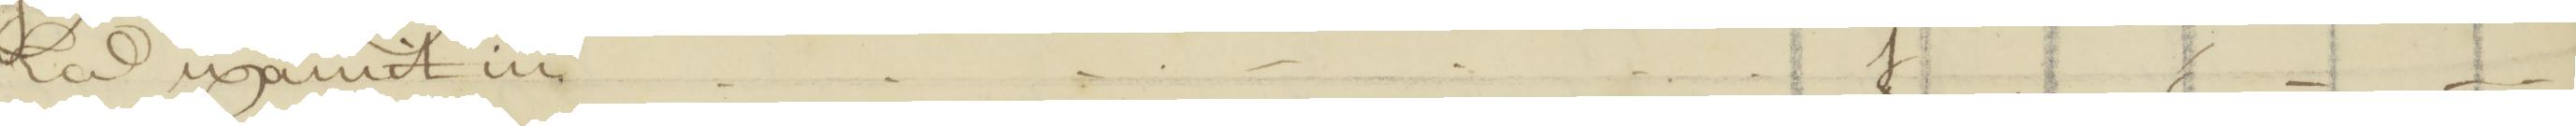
hae wamit in - - - – - - . . . 1 „ — — —
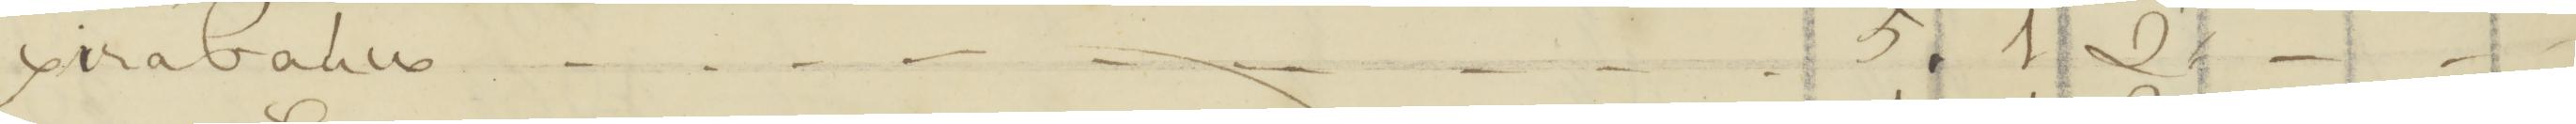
pirabauw – - – – – – – – - 5.1 2 „ — —
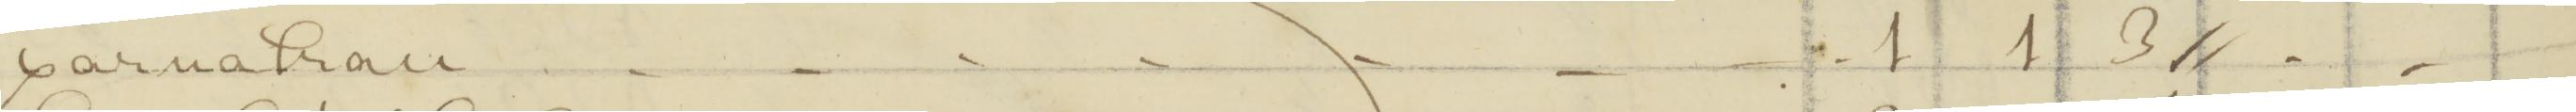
parnakan – – – – – – – -1. 1 3„ - -
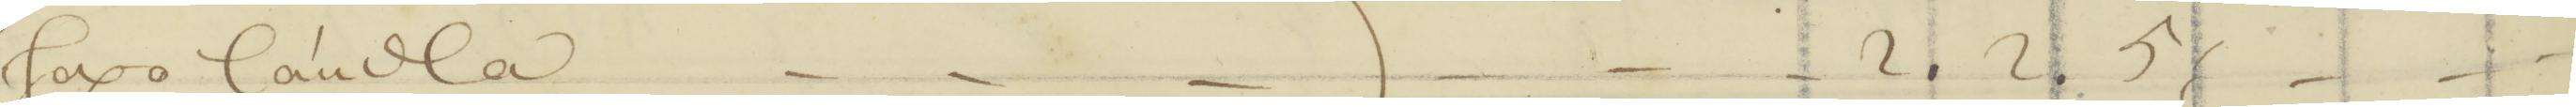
sapo lauela – – – – – – 2. 2. 5„ — — -
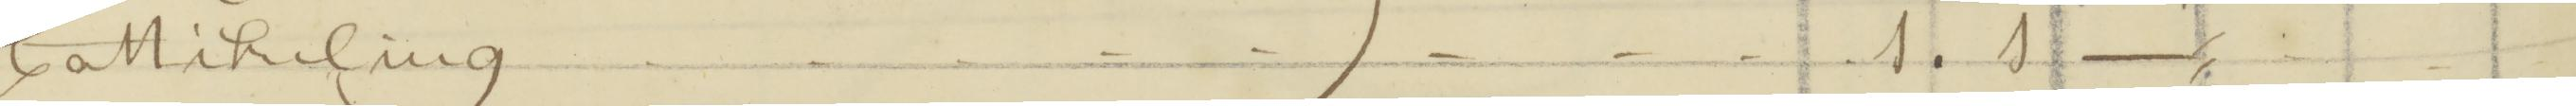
pattikiling . . . - - - - - . 1. 1 — „
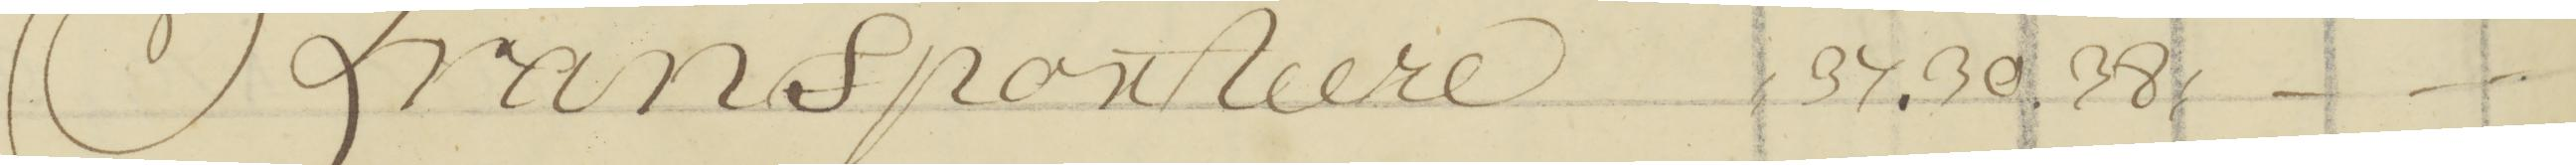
Transporteere „ 37. 30. 38 „ — — –
